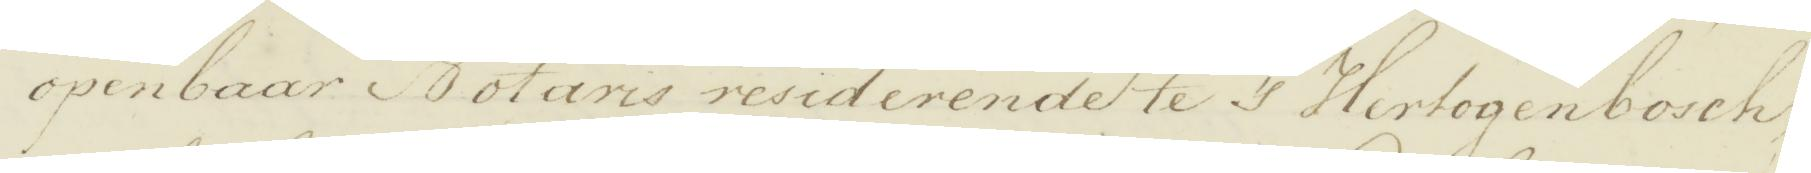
openbaar Notaris residerende te 's Hertogenbosch,
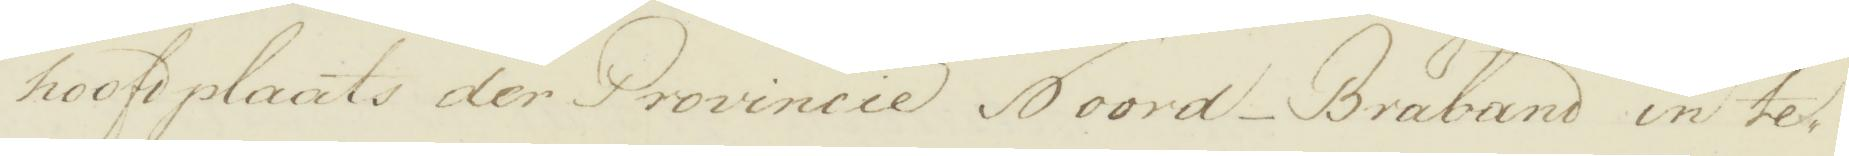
hoofdplaats der Provincie Noord-Braband in te„
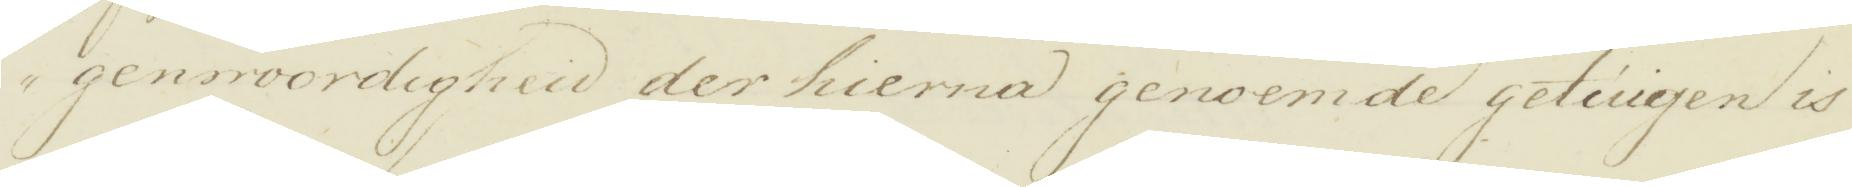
„genwoordigheid der hierna genoemde getuigen is
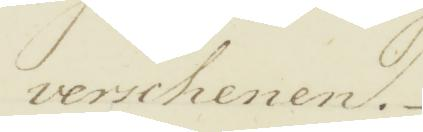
verschenen.
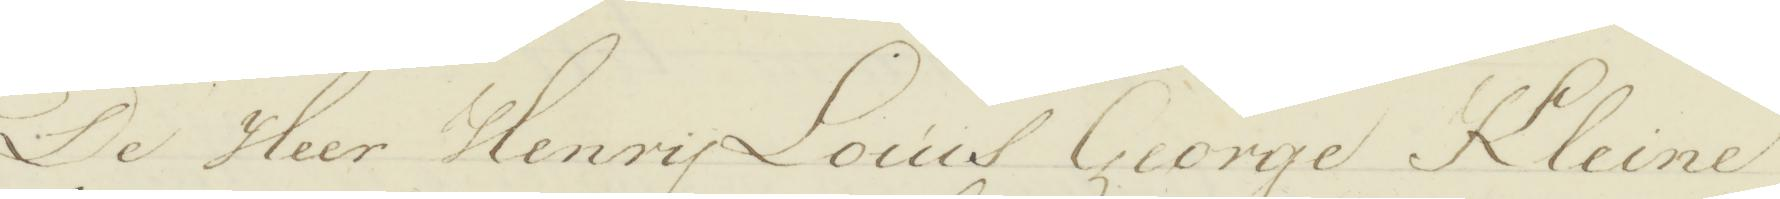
De Heer Henrij Louis George Kleine
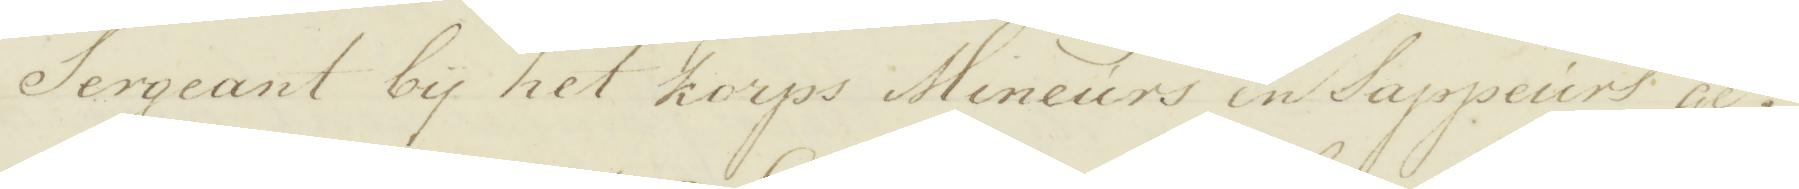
Sergeant bij het korps Mineurs en Sappeurs ge„
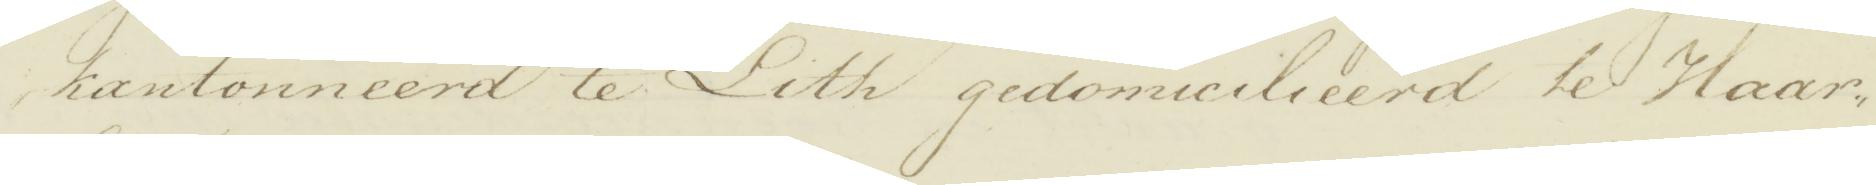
„kantonneerd te Lith gedomicilieerd te Haar„
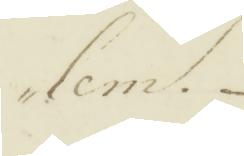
„lem.
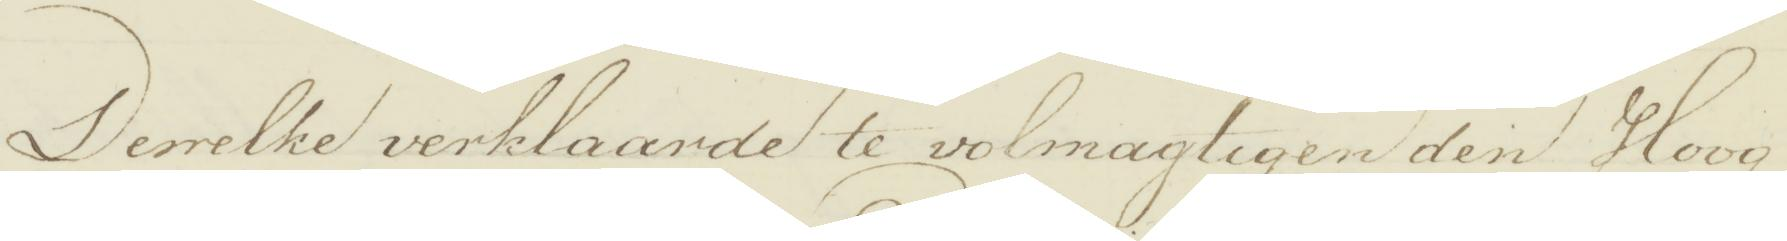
Dewelke verklaarde te volmagtigen den Hoog
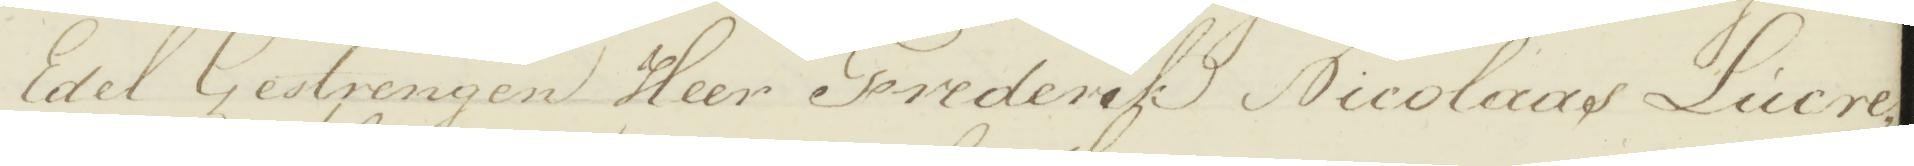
Edel Gestrengen Heer Frederik Nicolaas Lucre„
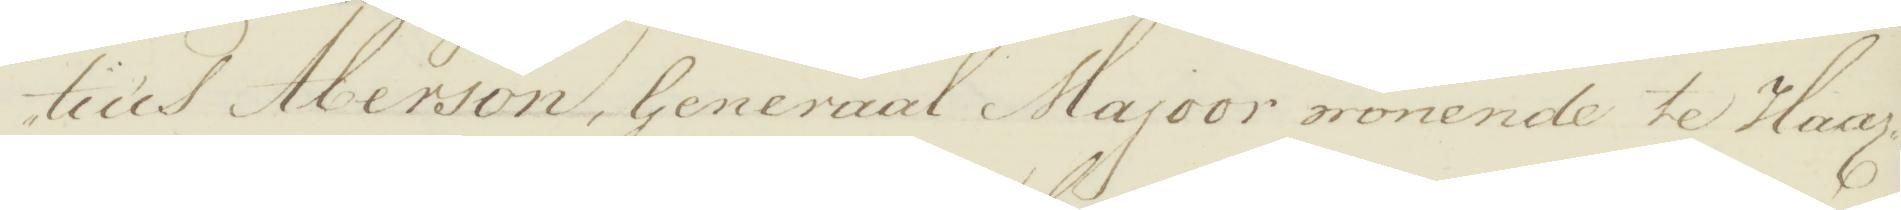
„tius Aberson, Generaal Majoor wonende te Haar
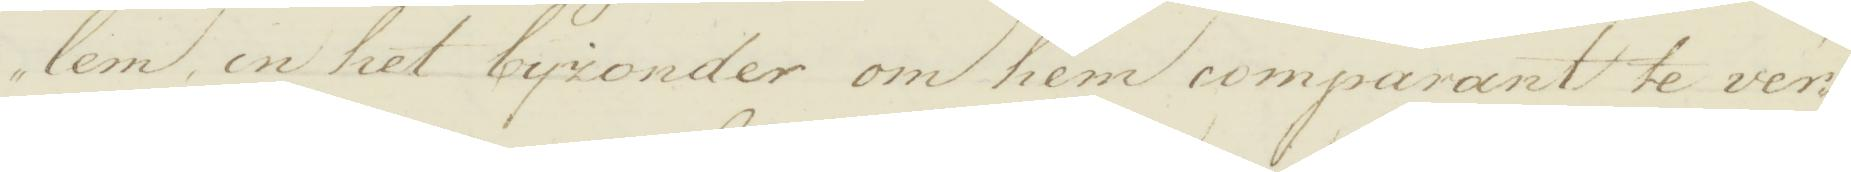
„lem, in het bijzonder om hem comparant te ver„
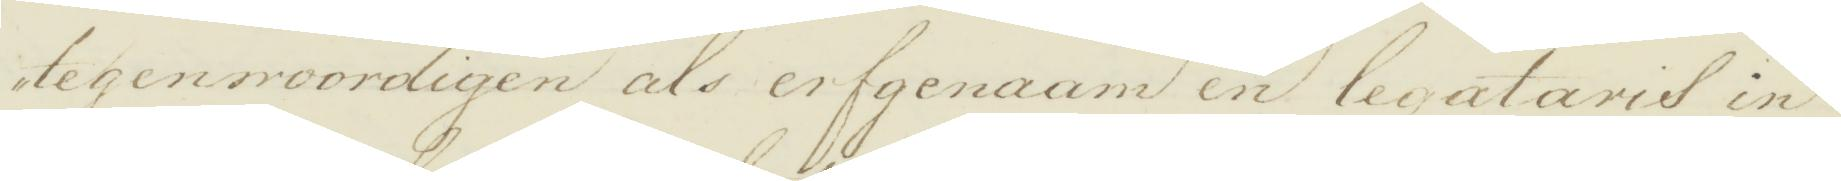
„tegenwoordigen als erfgenaam en legataris in
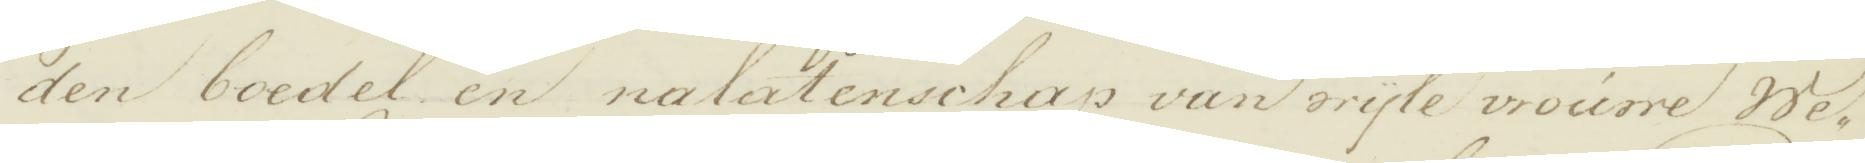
den boedel en nalatenschap van wijle vrouwe We„
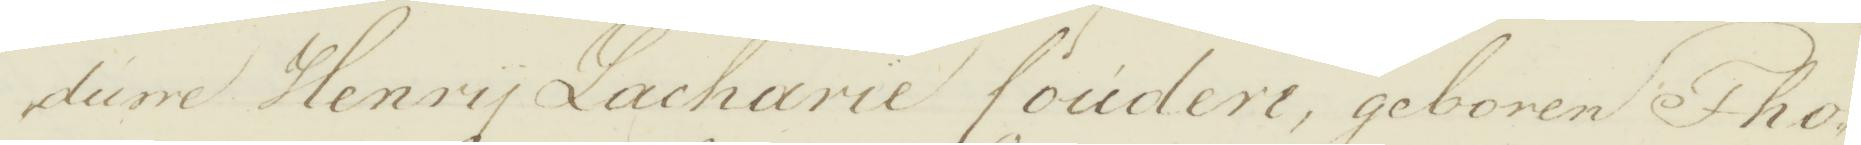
„duwe Henrij Zacharie Couderc, geboren Tho„
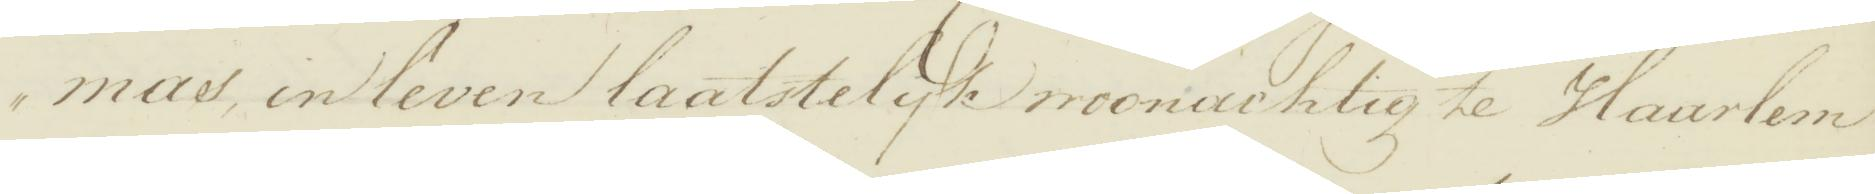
„mas, in leven laatstelijk woonachtig te Haarlem
